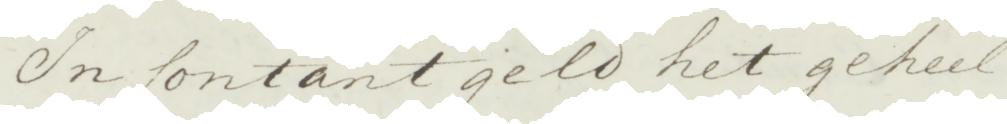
In Contant geld het geheel
